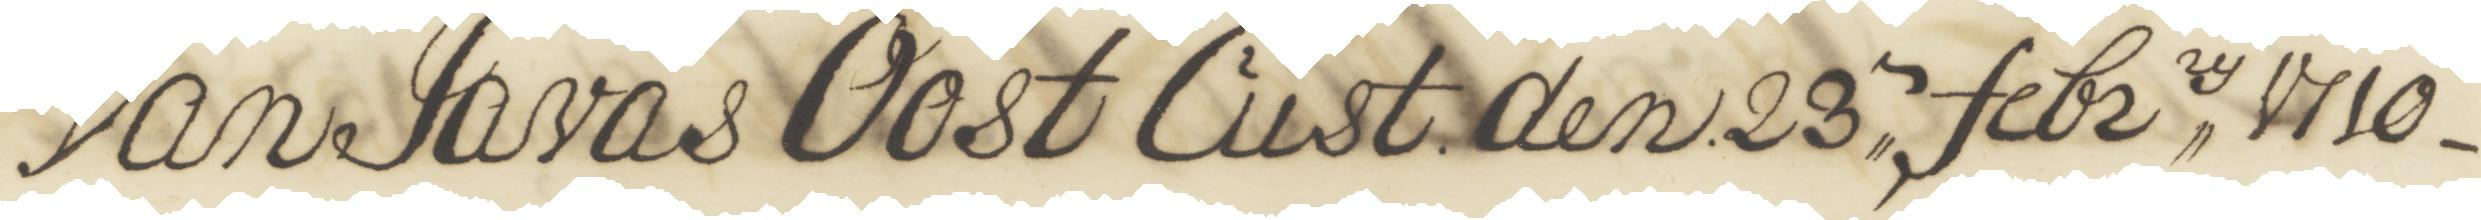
Van Iava's Oost Cust. den. 23„en febr„rij 1710_
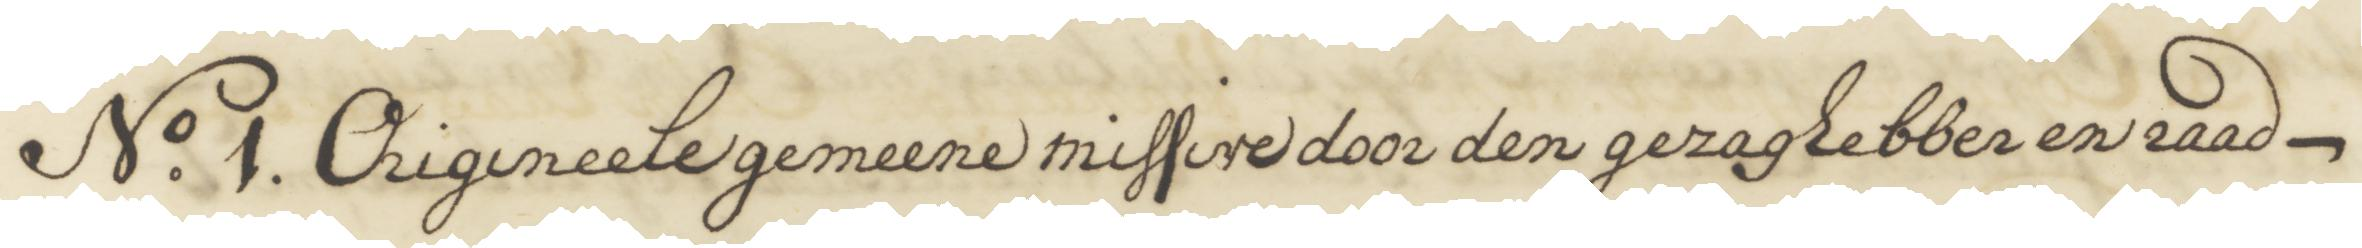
N.o 1. Origineele gemeene missive door den gezaghebber en raad —
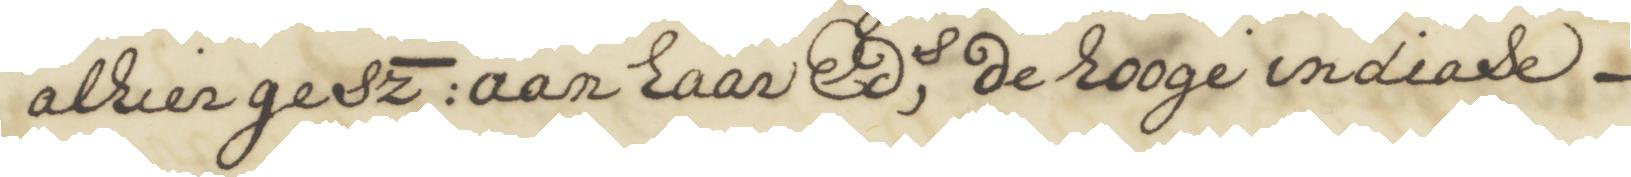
alhier gesz: aan haar Ed,s de hooge indiase —
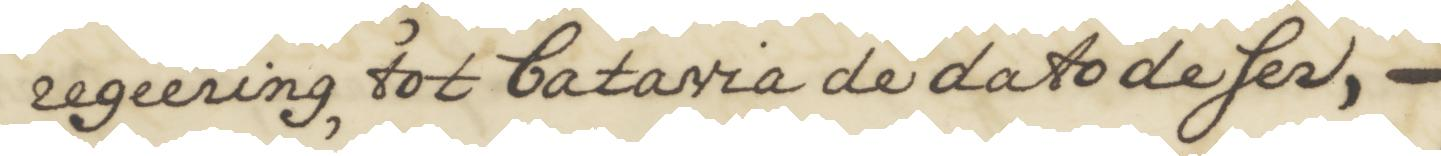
regeering, tot batavia de dato deser, —
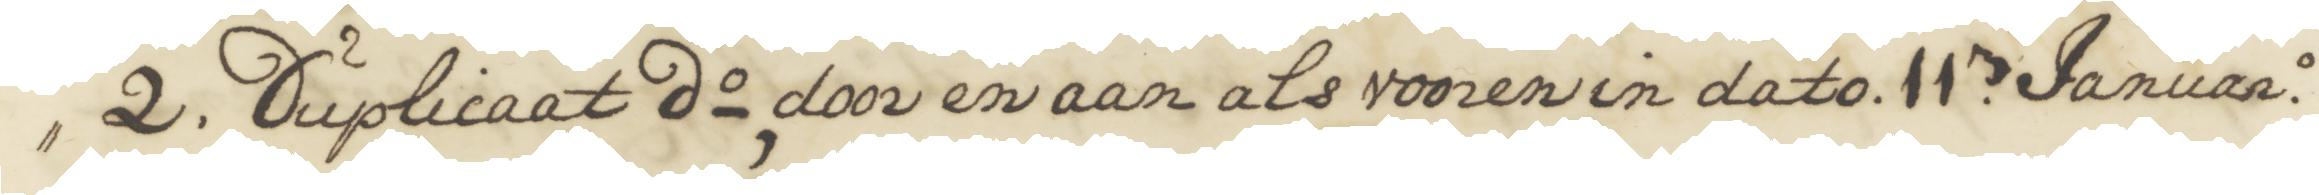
„ 2. duplicaat d_o, door en aan als vooren in dato. 11.en Ianuar.o
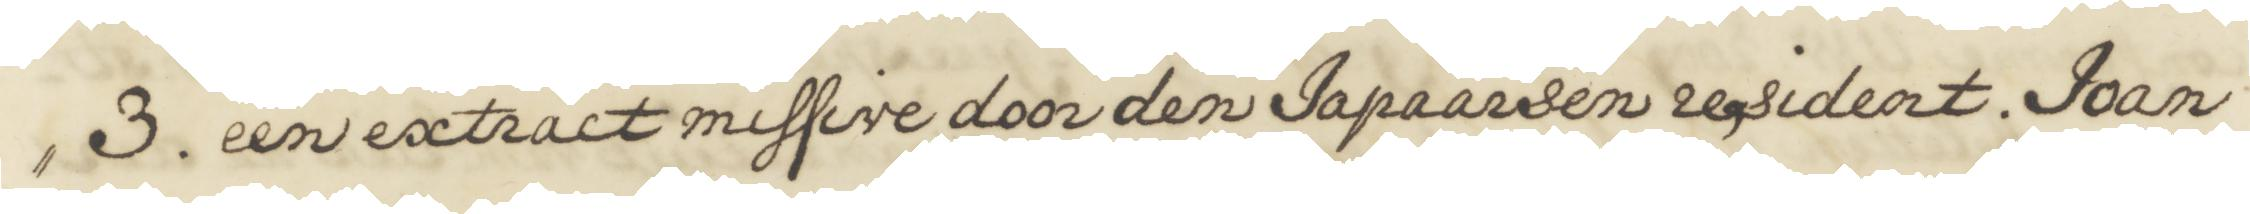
„ 3. een extract missive door den Iapaarsen resident. Ioan
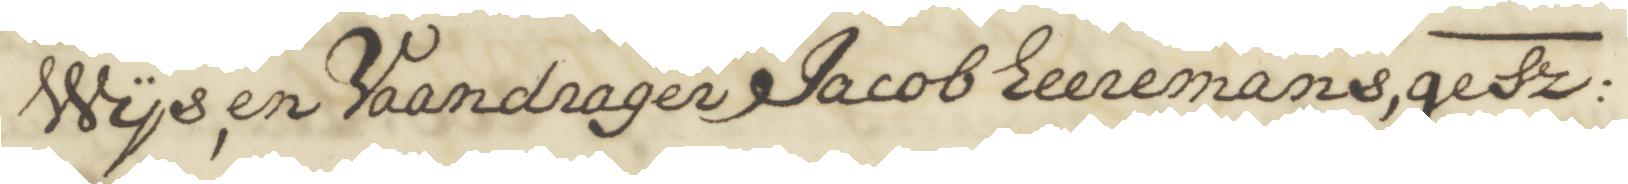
Wijs, en Vaandrager Iacob heeremans, gesz:
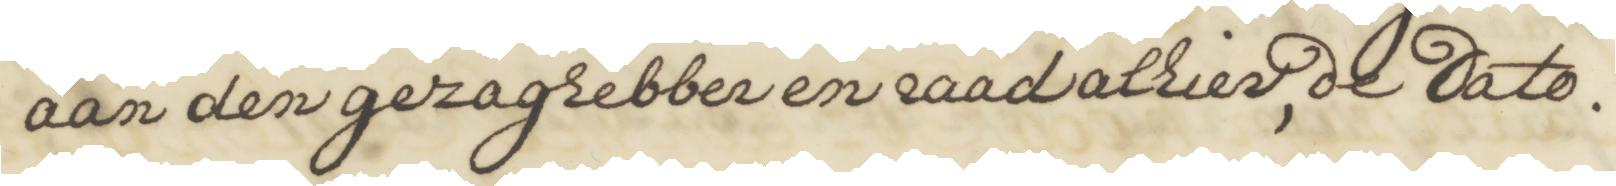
aan den gezaghebber en raad alhier, de dato.
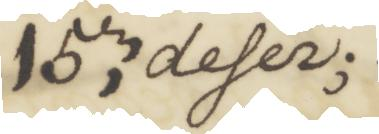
15„en deser;
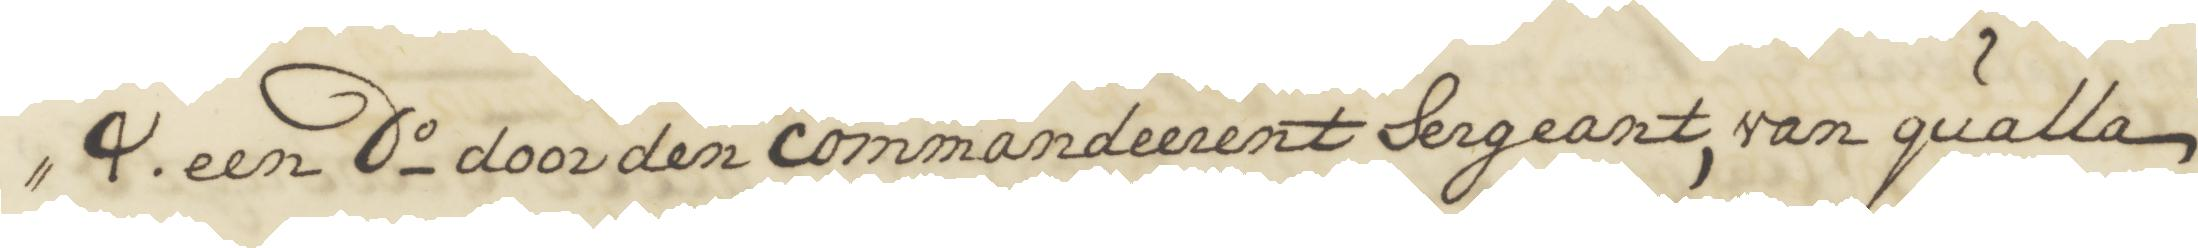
„ 4. een d_o door den commandeerent sergeant, van qualla
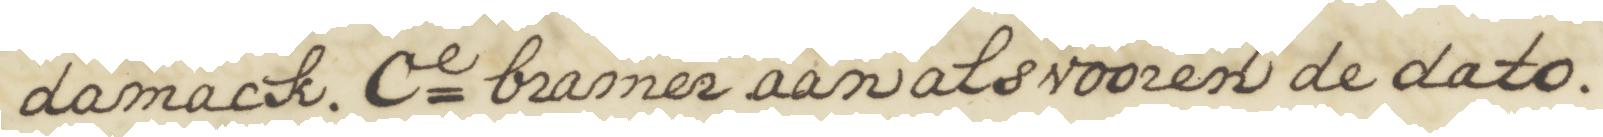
damack. C=l bramer aan als vooren de dato.
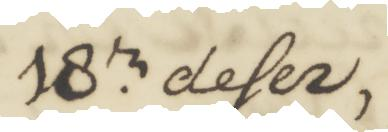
18.en deser,
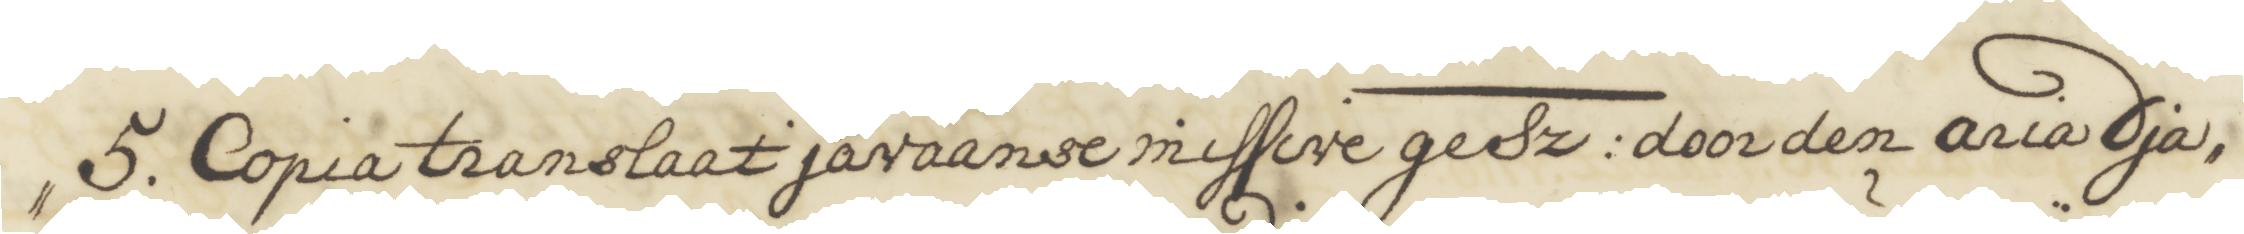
„ 5. Copia translaat javaanse missive gesz: door den aria dja„
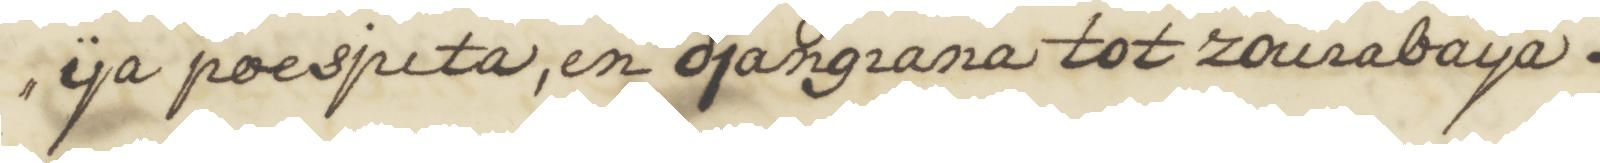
„ija poespita, en djangrana tot zourabaija
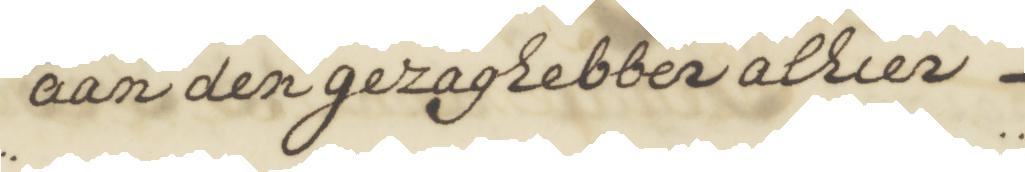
aan den gezaghebber alhier
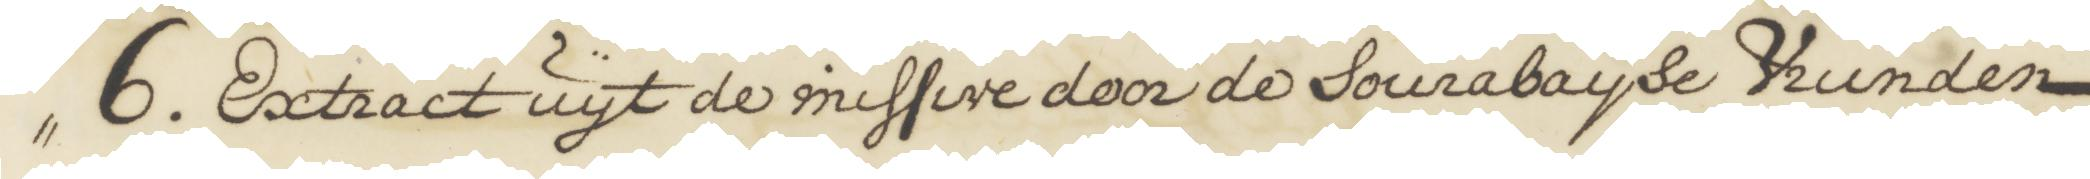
„ 6. Extract uijt de missive door de sourabaijse Vrunden
